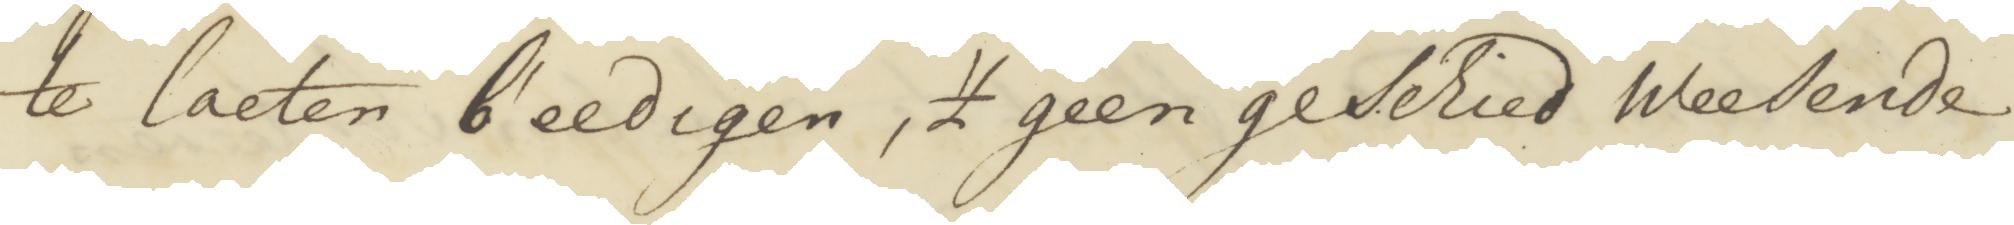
te laeten b'eedigen, ’t geen geschied weesende
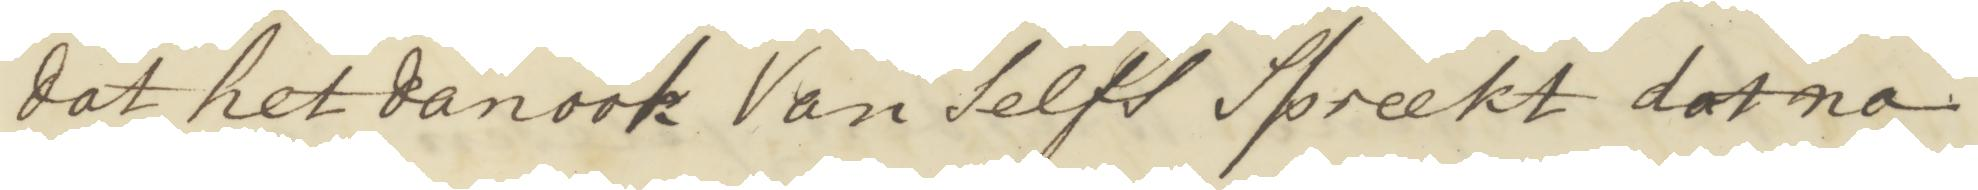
dat het dan ook van selfs spreekt dat na
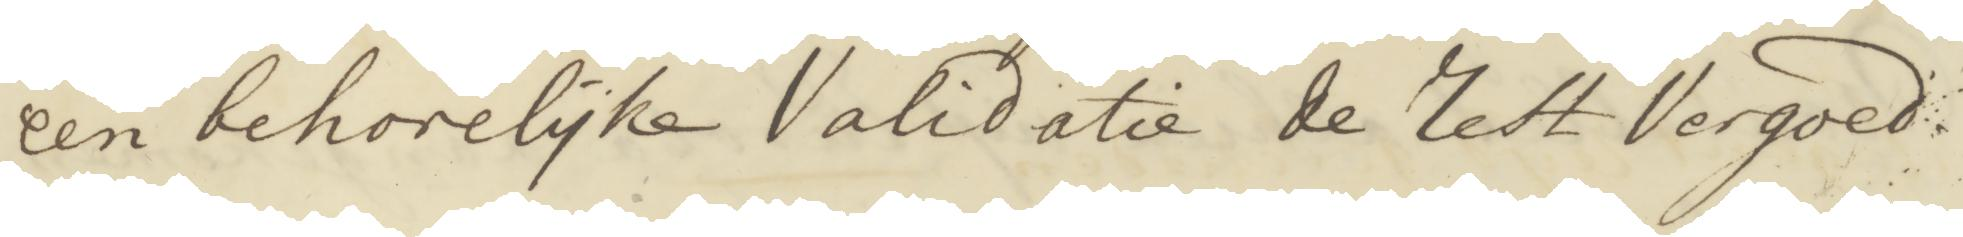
een behorelijke validatie de rest vergoed
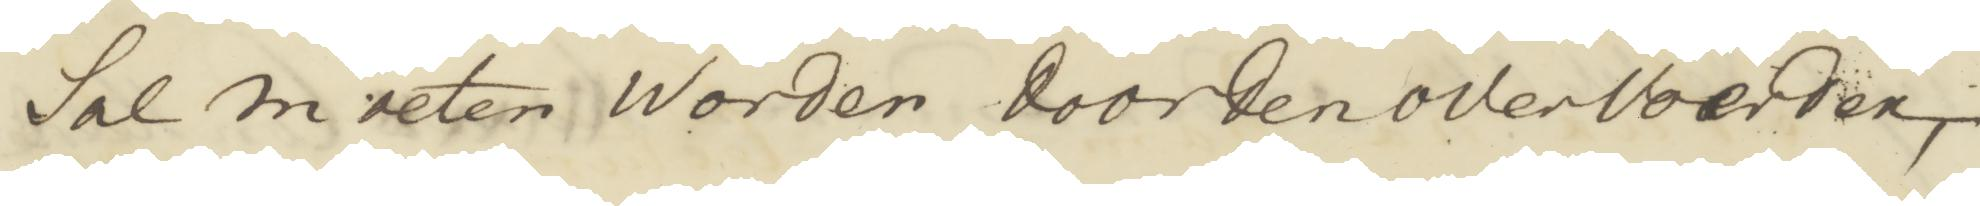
sal moeten worden door den overvoerder,
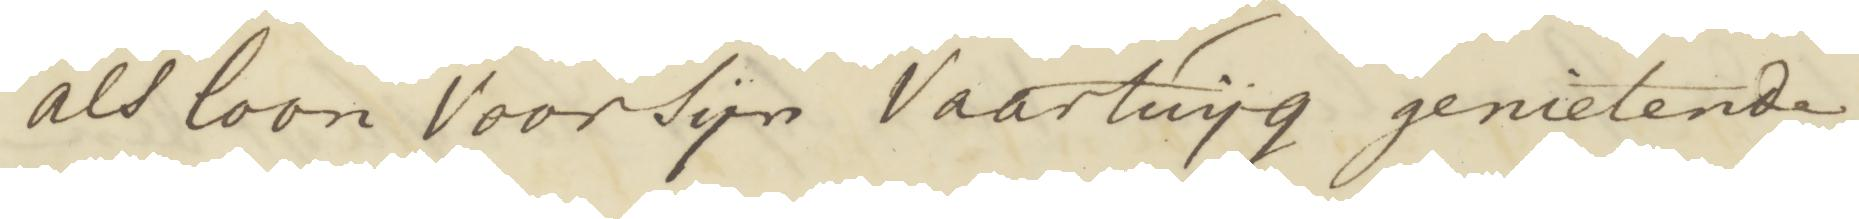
als loon voorsijn vaartuijg genietende
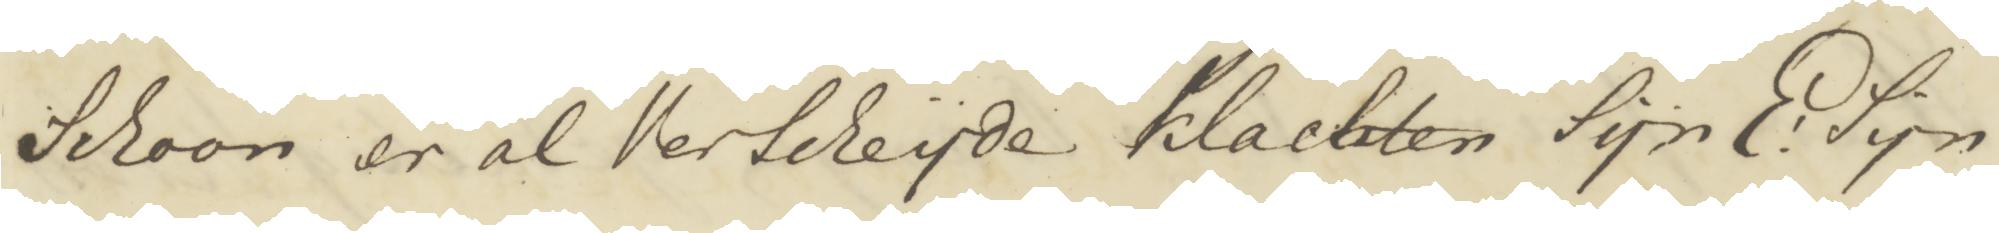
schoon er al verscheijde klachten sijn E: sijn
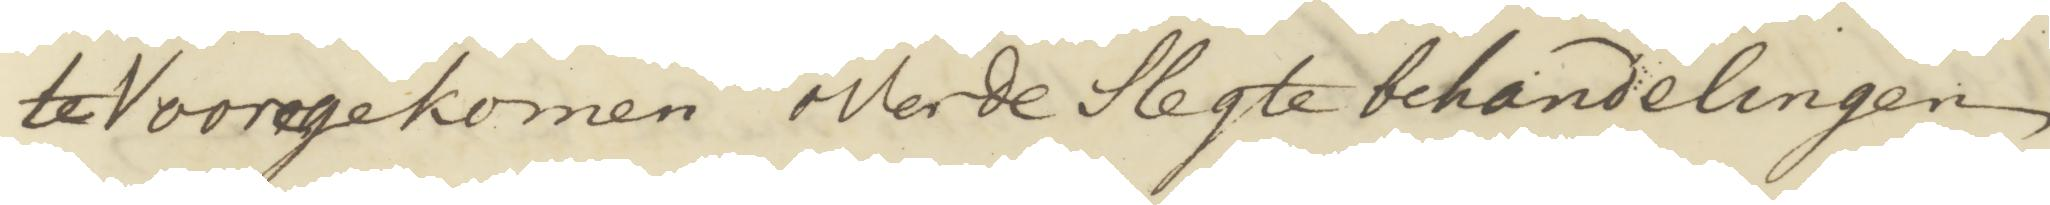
te vooregekomen overde slegte behandelingen
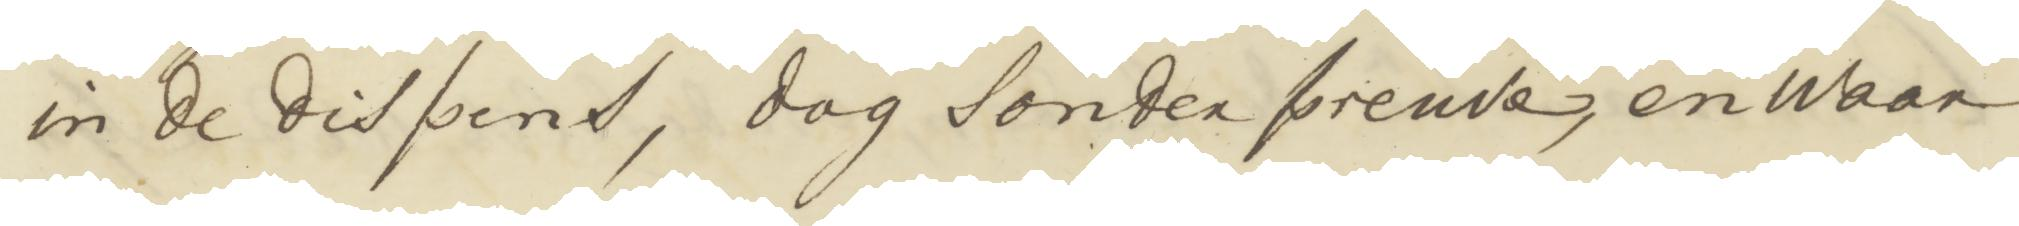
in de dispens, dog sonder preuve, en waar
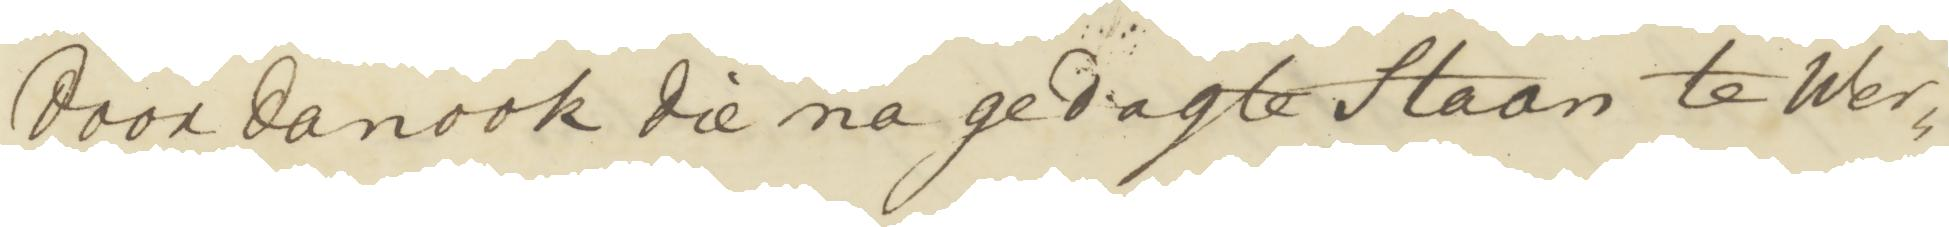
door dan ook die na gedagte staan te wer„
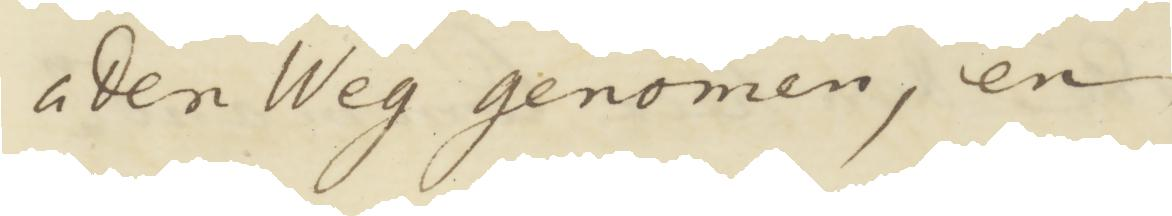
den weg genomen, en
